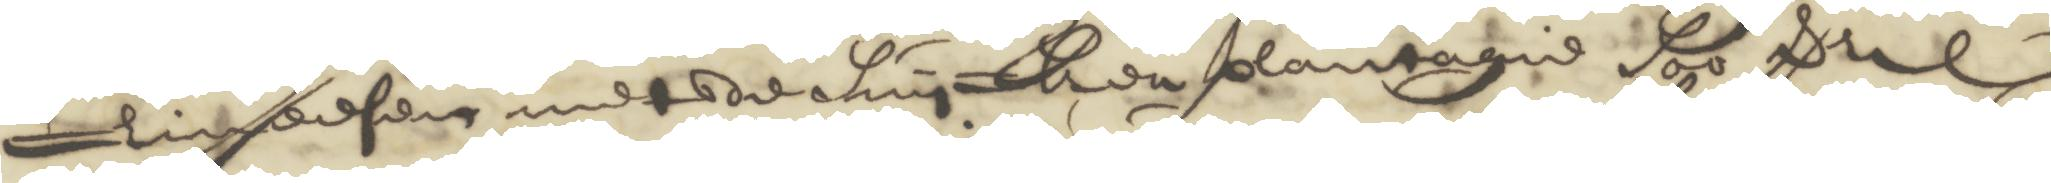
chineesen met de Suijcker plantagie Soo verre
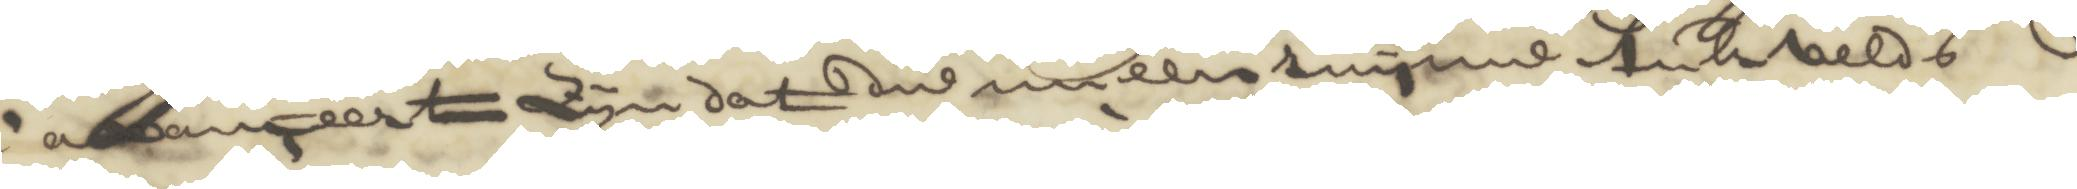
g' advanceert zijn dat die nu een ruijme stuk velds
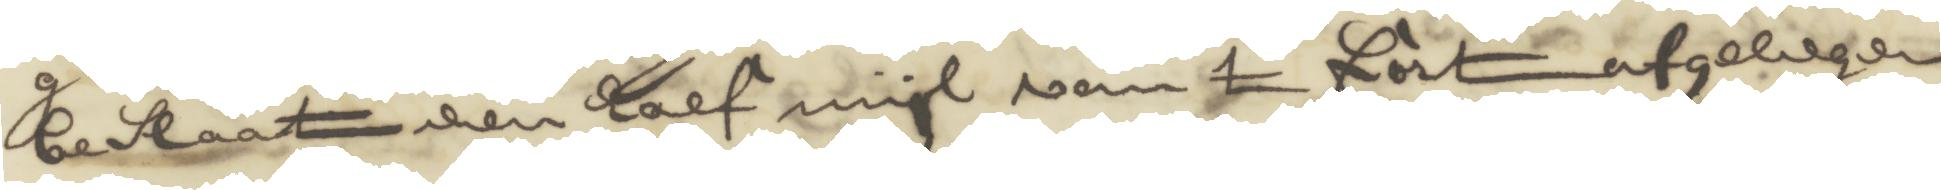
beslaat een half mijl van ’t fort afgelegen
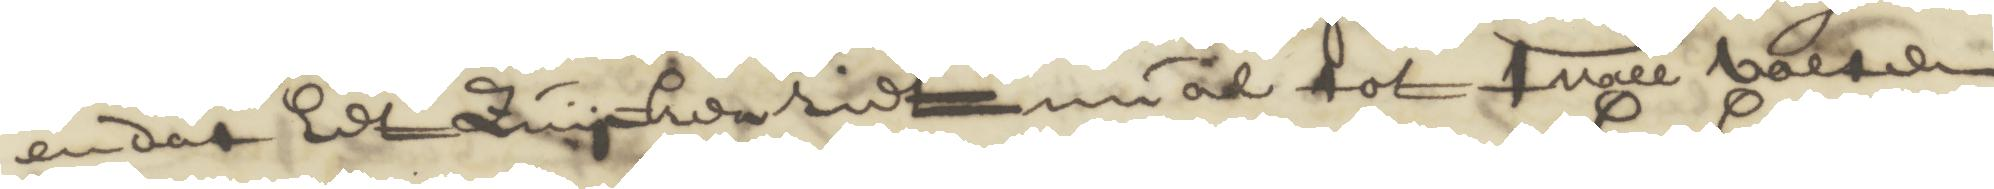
en dat het Zuijcker riet nu al tot twee volten
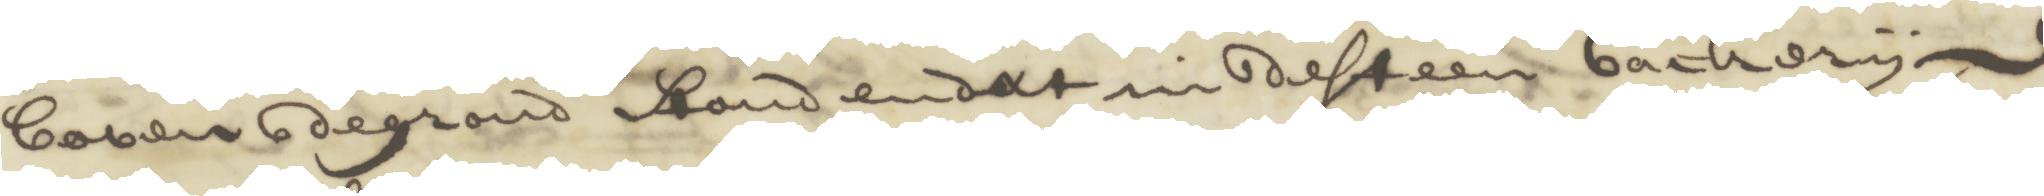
boven degrond stond en dat in desteen backerije
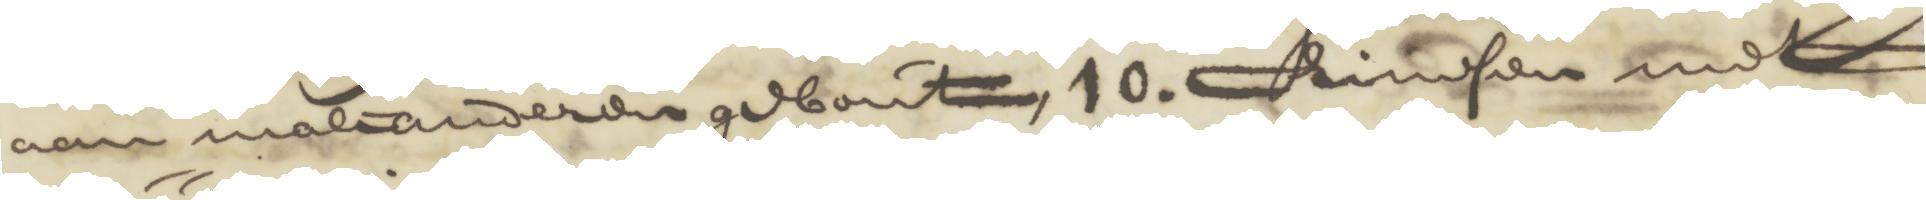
aan malcanderen gebout, 10. Chinesen met
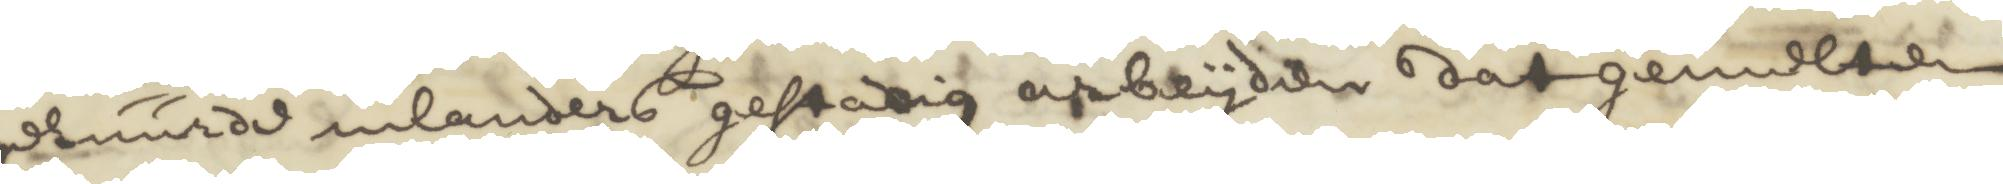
gehuurde inlanders gestadig arbeijden dat gemelten
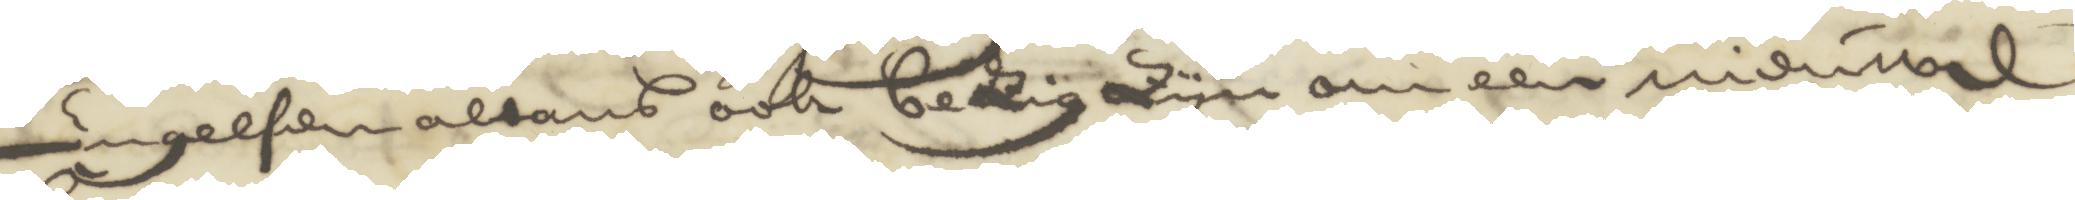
Engelsen altans ook bezig Zijn om een nieuwe
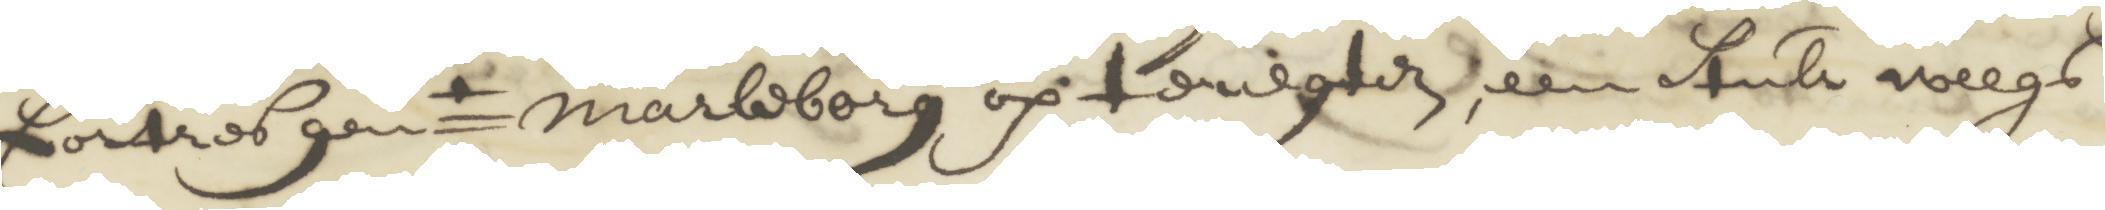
fortres gen=t marleborg op teregten, een stuk weegs
